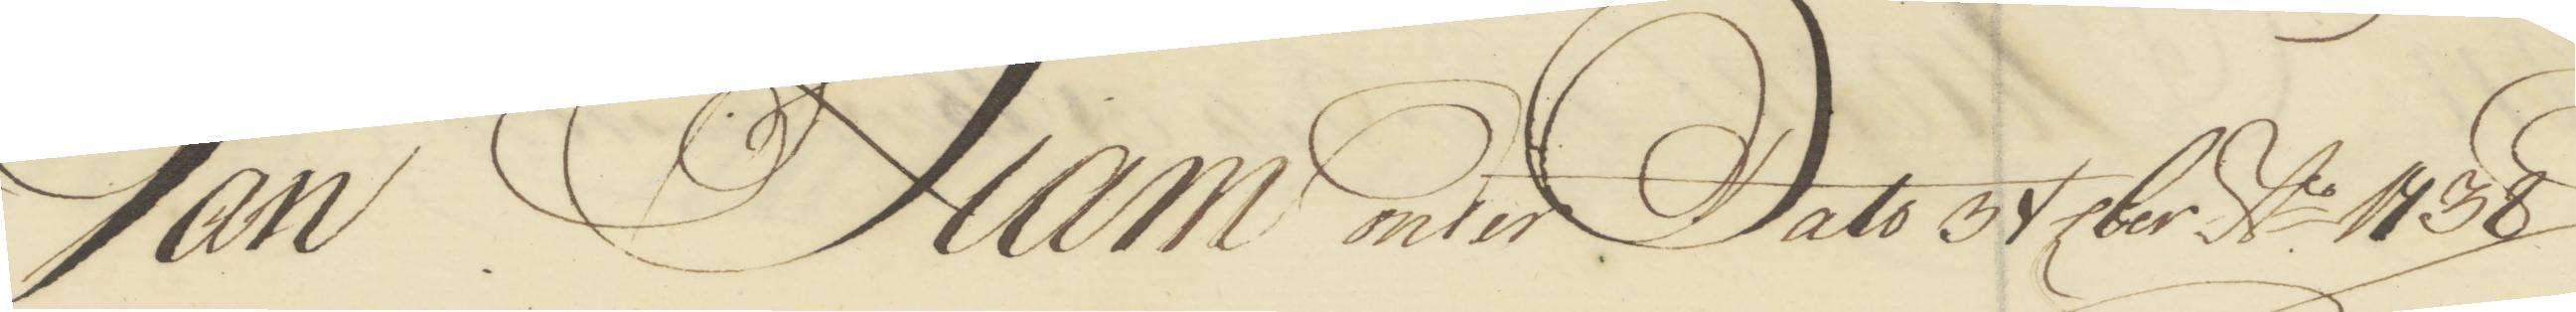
Van Siam onder Dato 31 xber A=o 1738
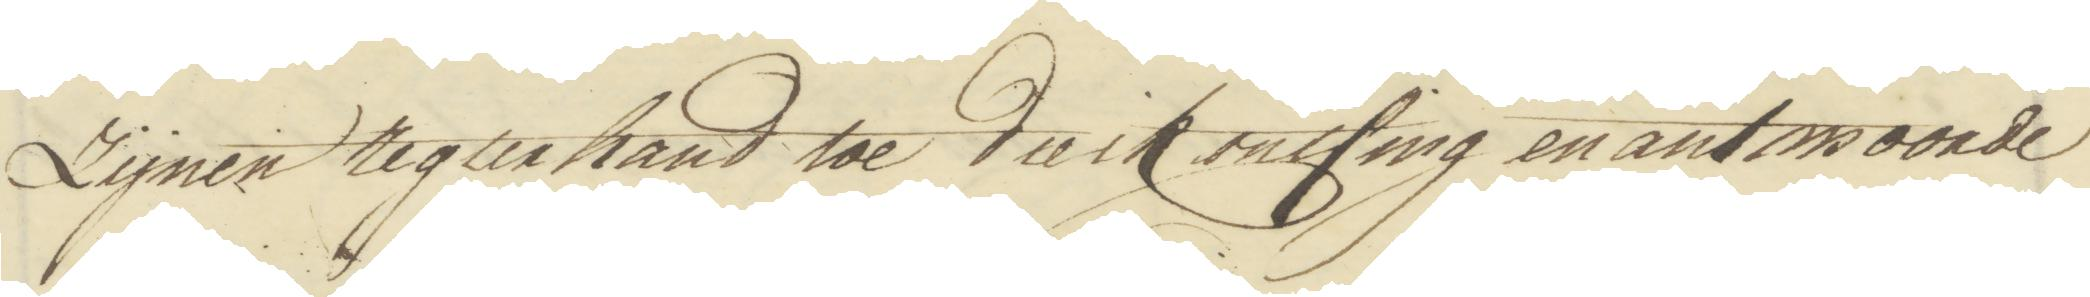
zijnen regter hand toe die ik ontfing en antwoorde
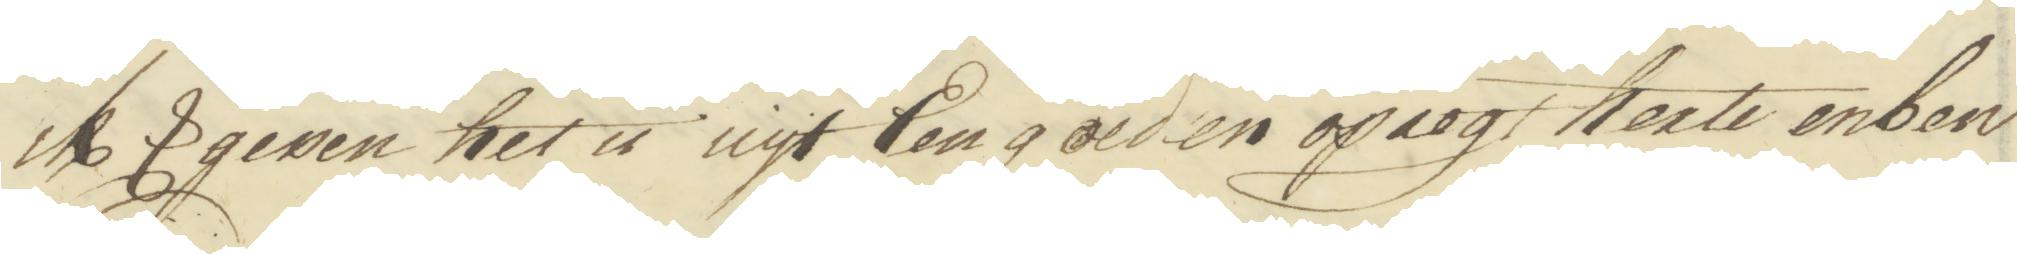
ik vergeven het u uijt Een goeden opregt herte en ben
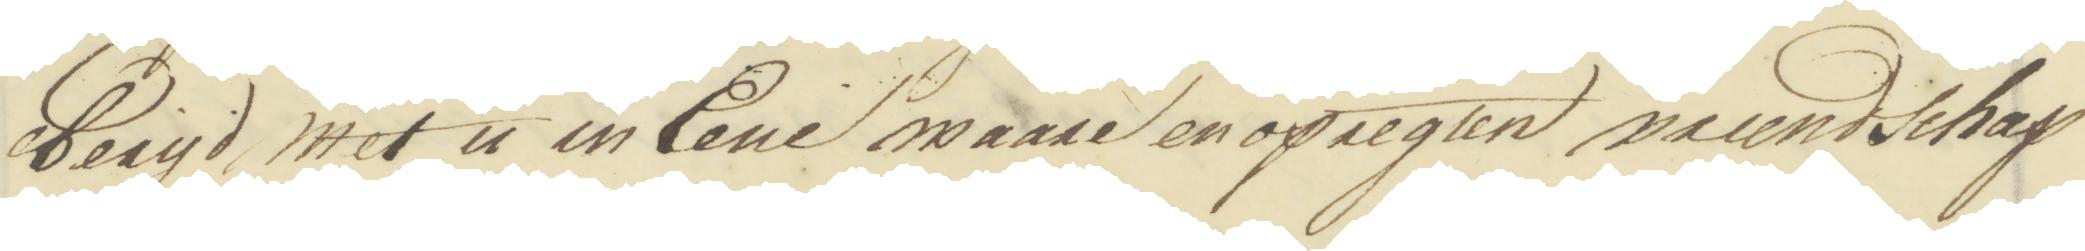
berijd met u in Eene waare en opregten vriendschap
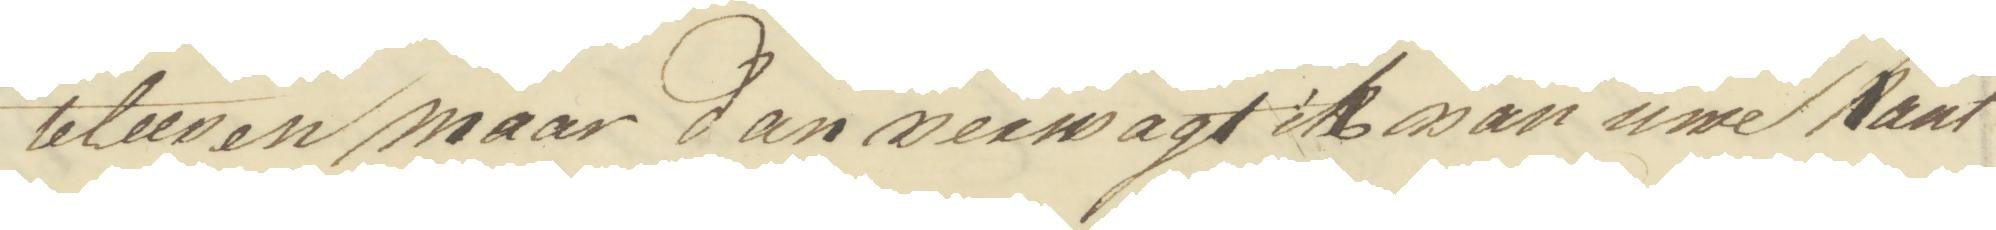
te leeven maar dan verwagt ik van uwe kant
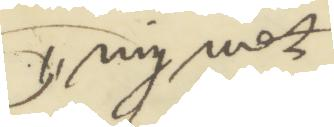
„ mij met
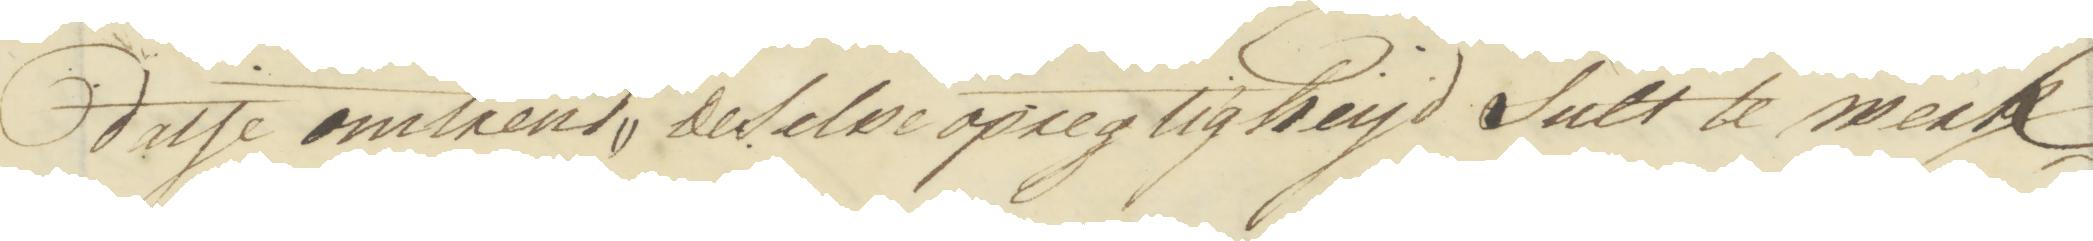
datje omtrent „ deselve opregtigheijd sult te werk
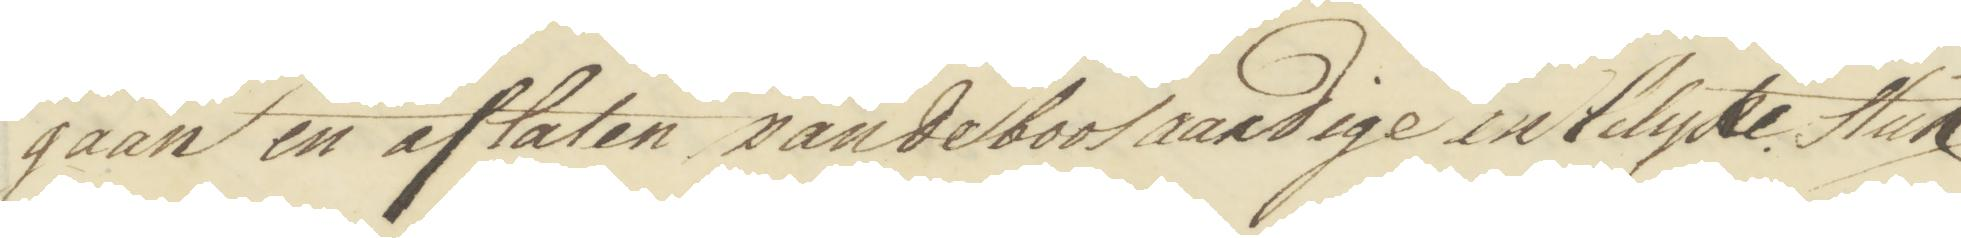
gaan en aflaten van de boosaardige en lelijke stuk
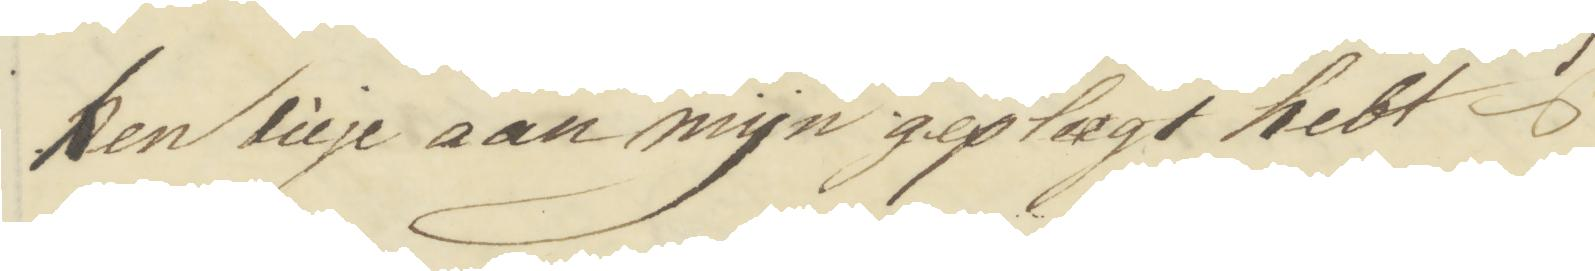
ken dieje aan mijn gepleegt hebt
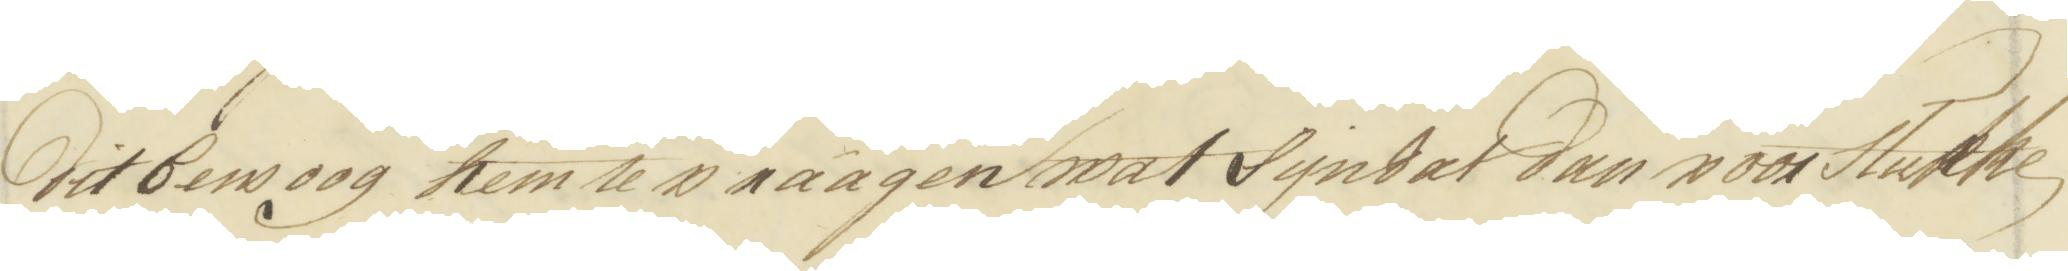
dit bewoog hem te vraagen wat sijn dat dan voor stukken
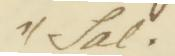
„ Sal.
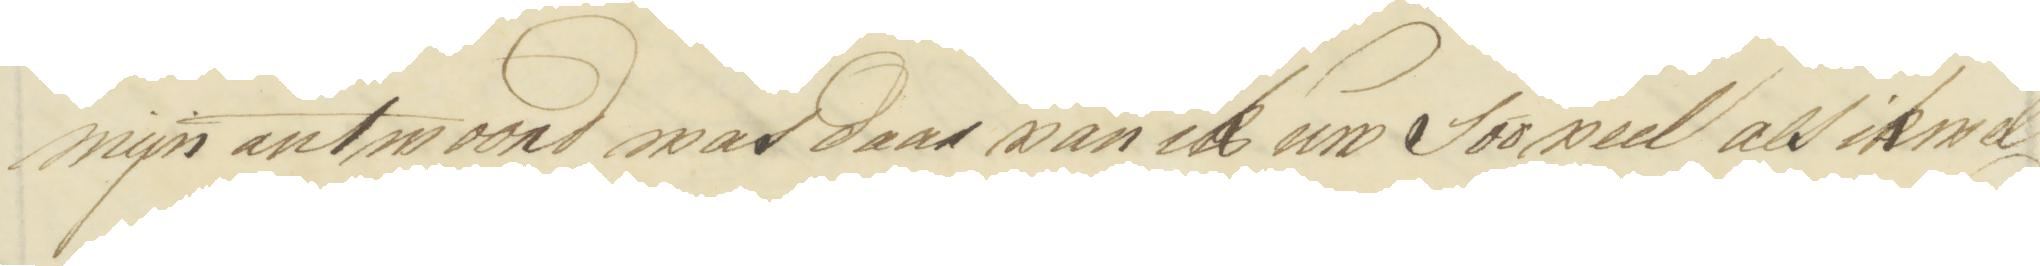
mijn antwoord was daar van „ ik uw soo veel als ik wel
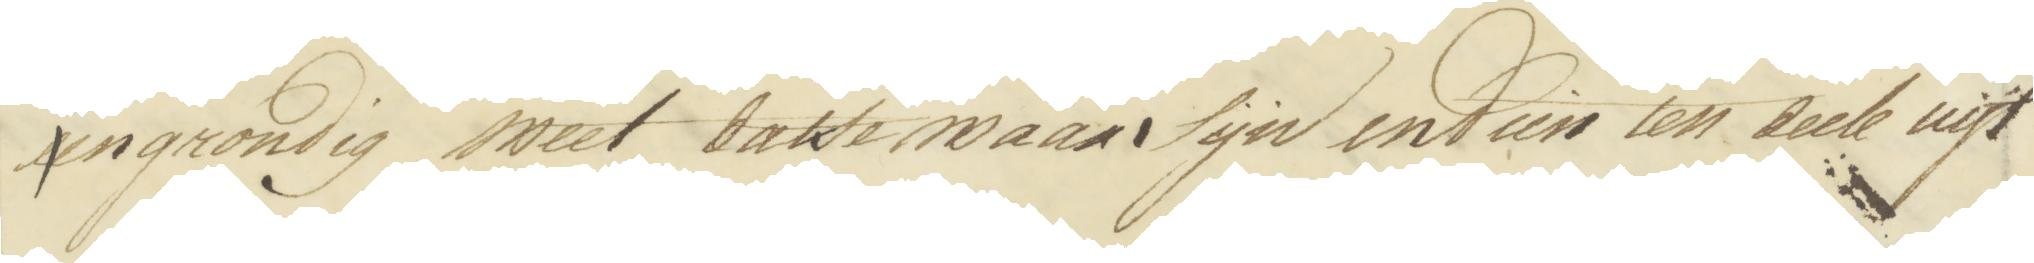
een grondig weet datse waar sijn en dien ten deele uijt
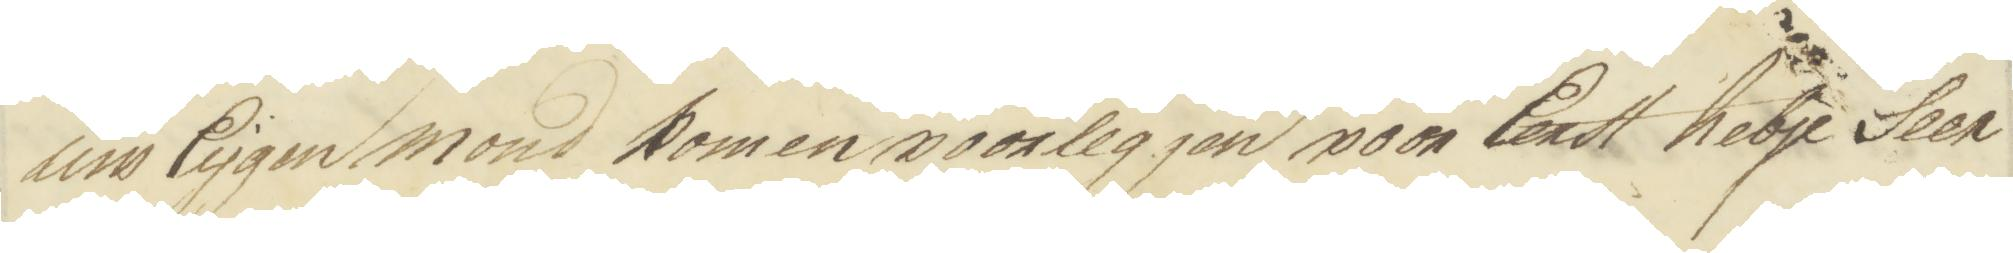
uw Eijgen mond komen voorleggen voor Eerst hebje seer
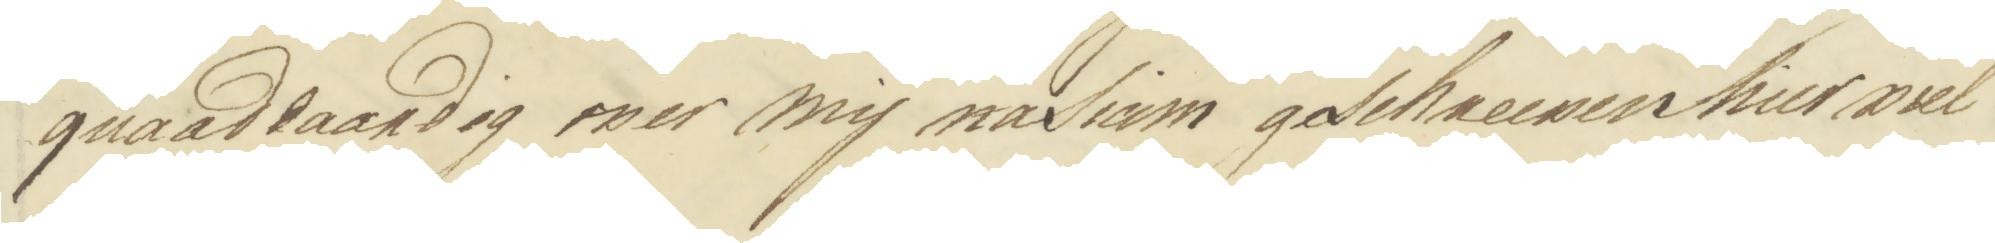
quaadtaardig over mij na siam geschreeven hier viel
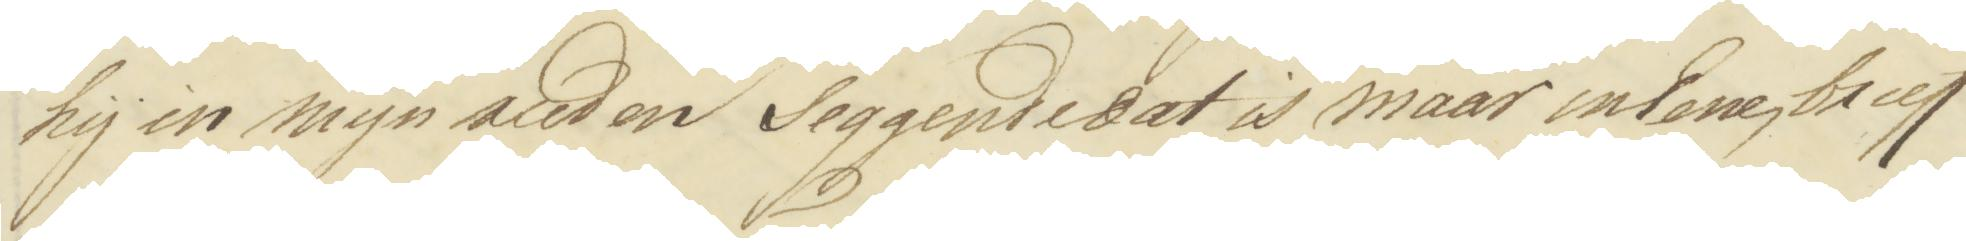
hij in mijn reeden seggende dat is maar in Eenen, brieff
